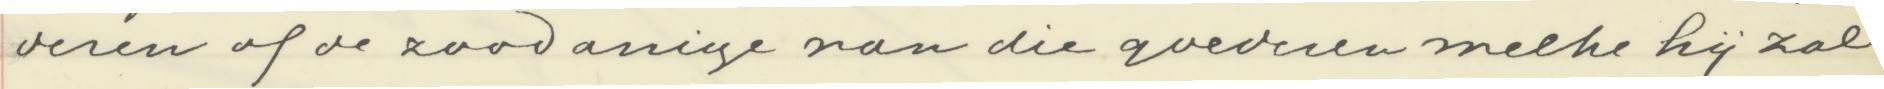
deren of de zoodanige van die goederen welke hij zal
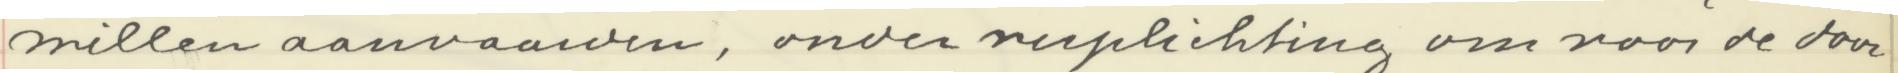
willen aanvaarden, onder verplichting om voor de door
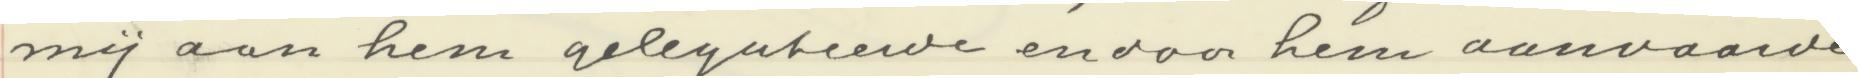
mij aan hem gelegateerde en door hem aanvaarde
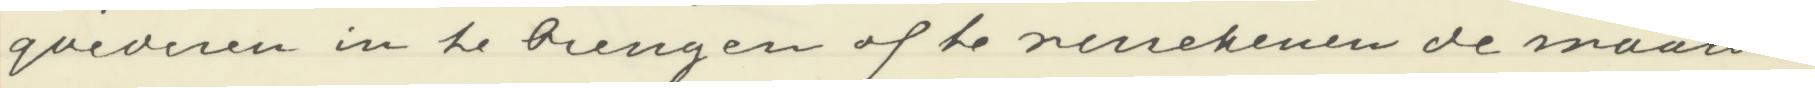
goederen in te brengen of te verrekenen de waarde
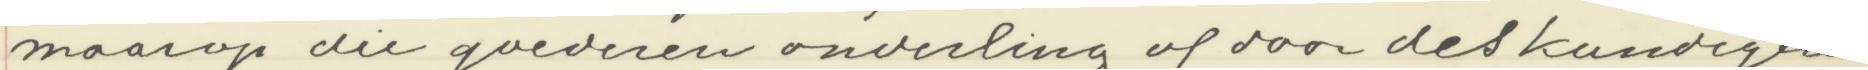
waarop die goederen onderling of door deskundigen
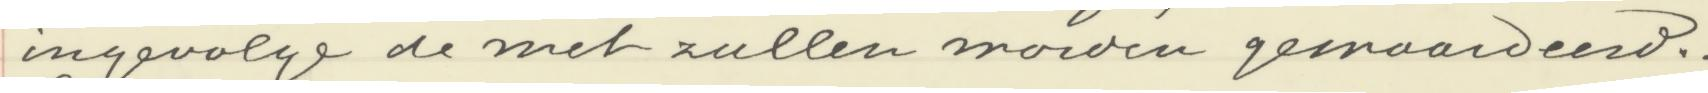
ingevolge de wet zullen worden gewaardeerd.
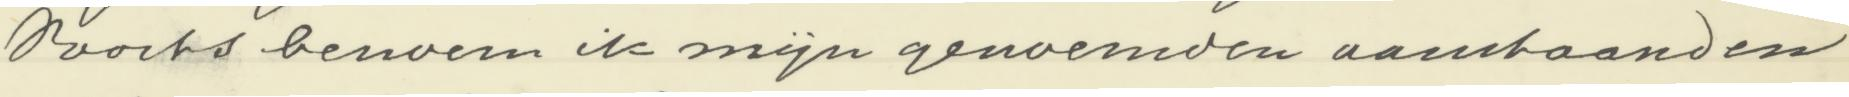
Voorts benoem ik mijn genoemden aanstaanden
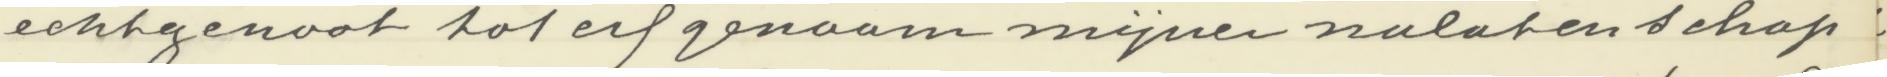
echtgenoot tot erfgenaam mijner nalatenschap
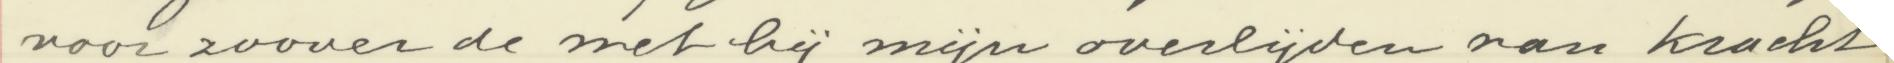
voor zoover de wet bij mijn overlijden van kracht
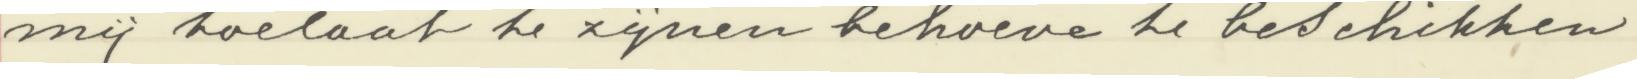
mij toelaat te zijnen behoeve te beschikken
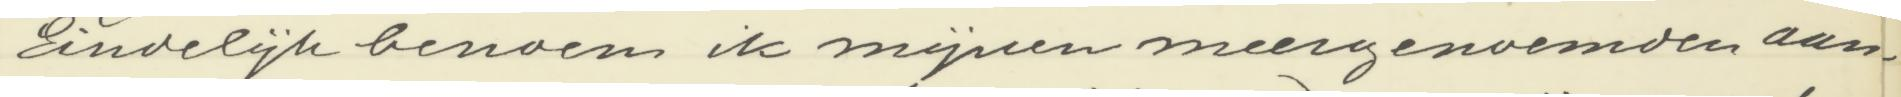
Eindelijk benoem ik mijnen meergenoemden aan
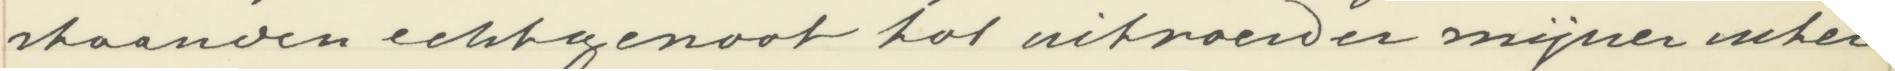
staanden echtgenoot tot uitvoerder mijner uiter
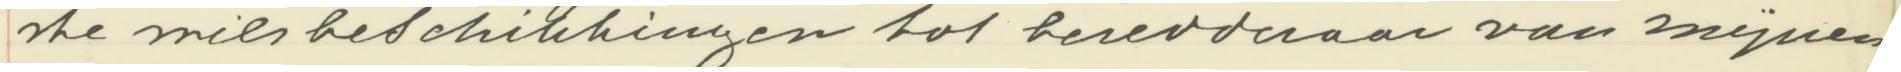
te wils beschikkingen tot beredderaar van mijnen
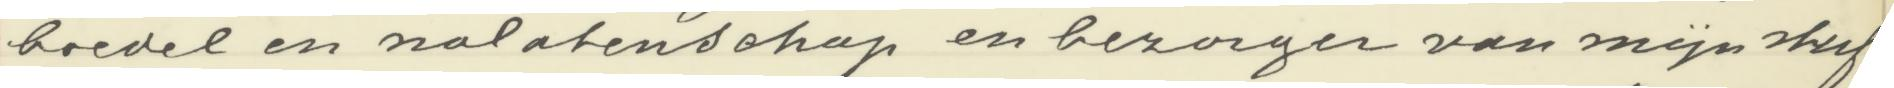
boedel en nalatenschap en bezorger van mijn sterf
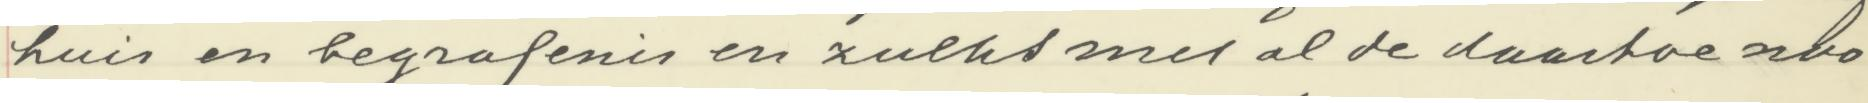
huis en begrafenis en zulks met al de daartoe noo
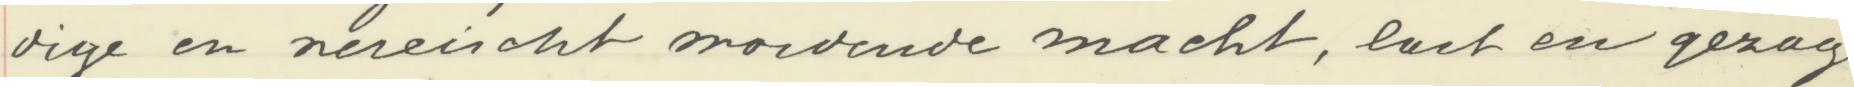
dige en vereischt wordende macht, last en gezag
